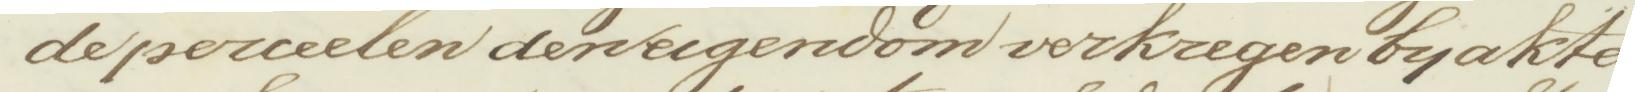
de perceelen den eigendom verkregen by akte
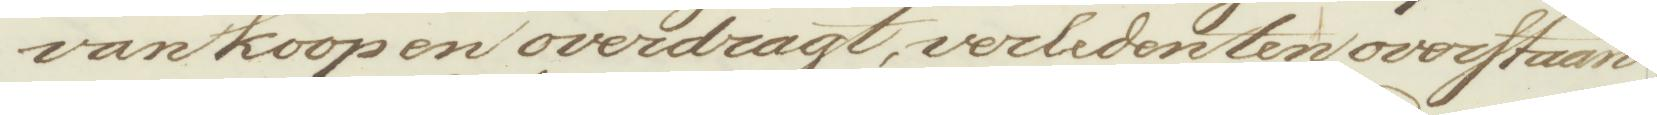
van koop en overdragt, verleden ten overstaan.
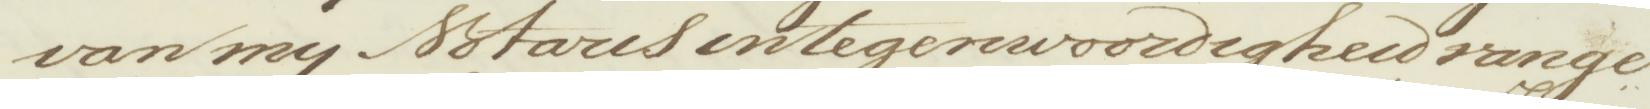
van my Notaris in tegenwoordigheid vange„
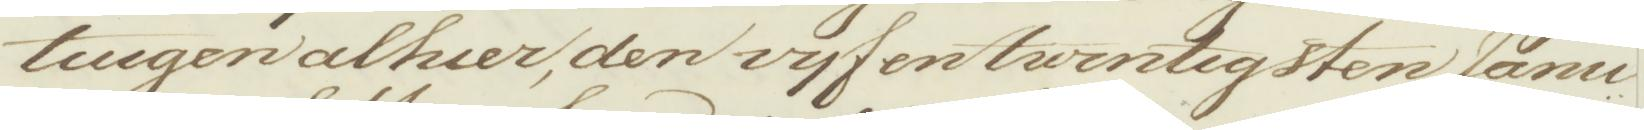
tuigen alhier, den vyf en twintigsten Janu„
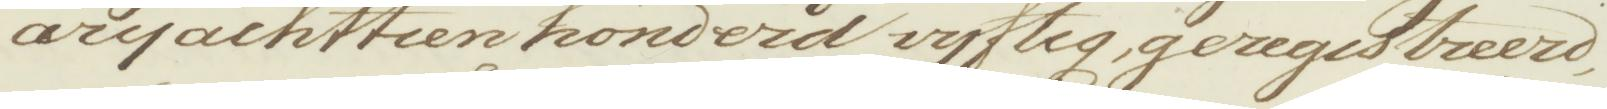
ary achttien honderd vyftig, geregistreerd,
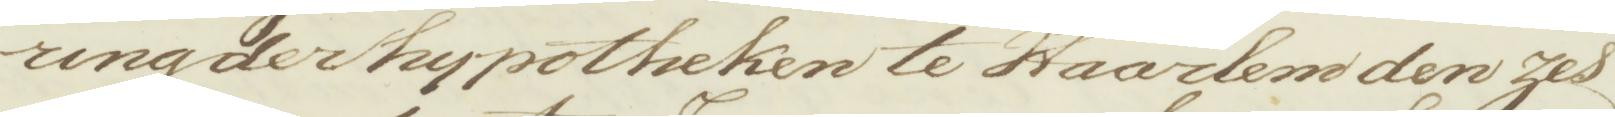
ring der hypotheken te Haarlem den zes
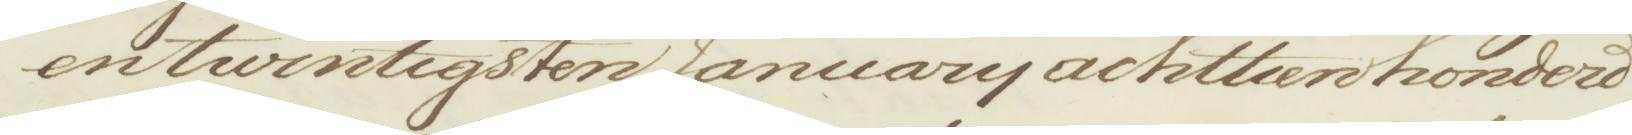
en twintigsten January achttien honderd
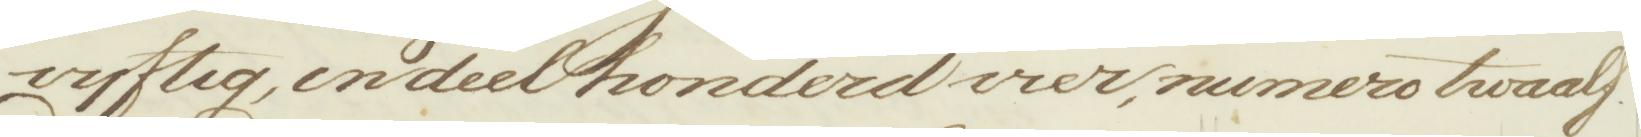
vyftig, in deel honderd vier, numero twaalf.
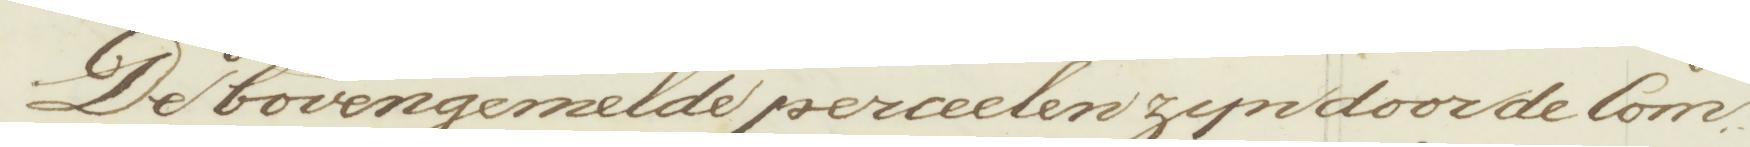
De bovengemelde perceelen zyn door de Com„
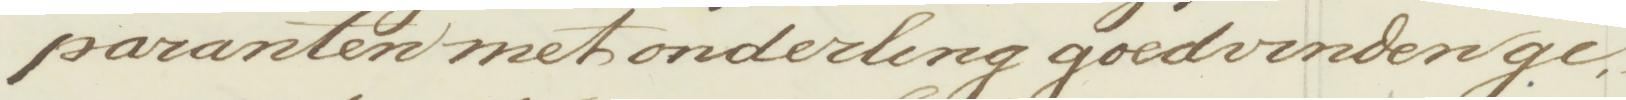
paranten met onderling goedvinden ge„
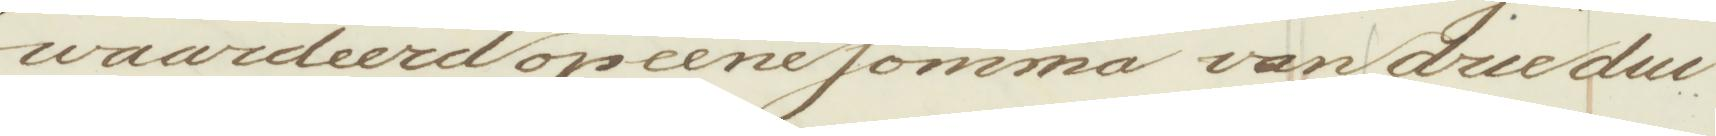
waardeerd op eene somma van drie dui„
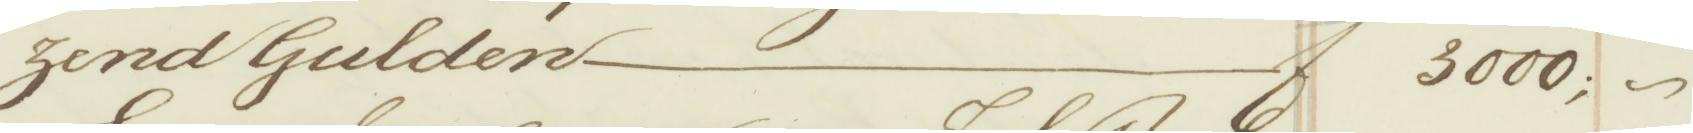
zend Gulden — ƒ 3000; —
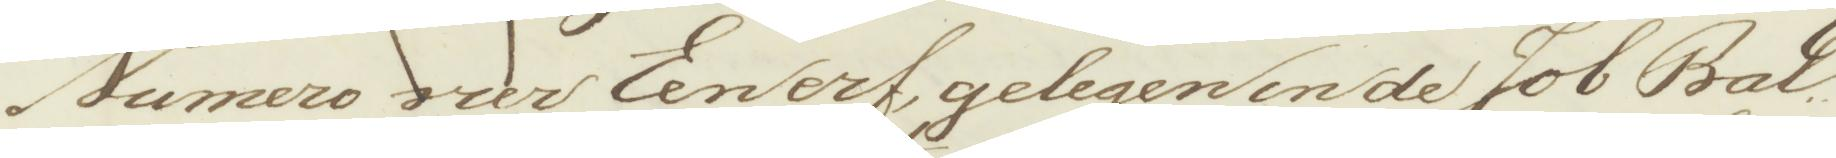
Numero vier. Een erf, gelegen in de Job Bal„
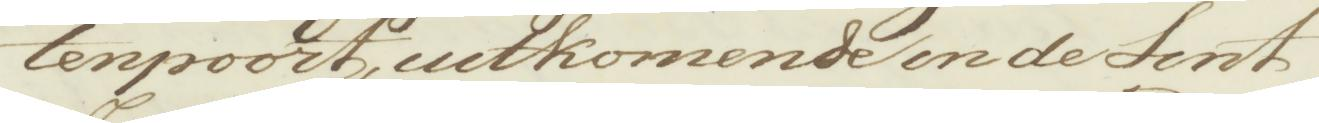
tenpoort, uitkomende in de Sint
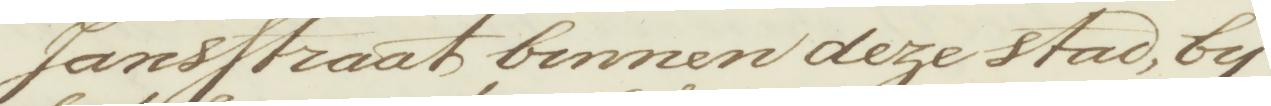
Jansstraat binnen deze stad, by
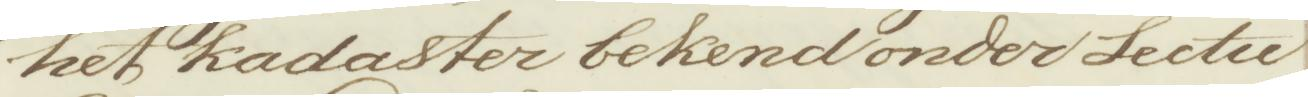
het kadaster bekend onder sectie
